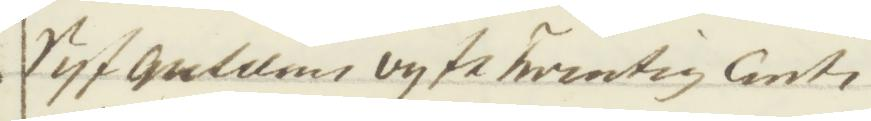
Vyf guldens vyf & Twintig Cents
